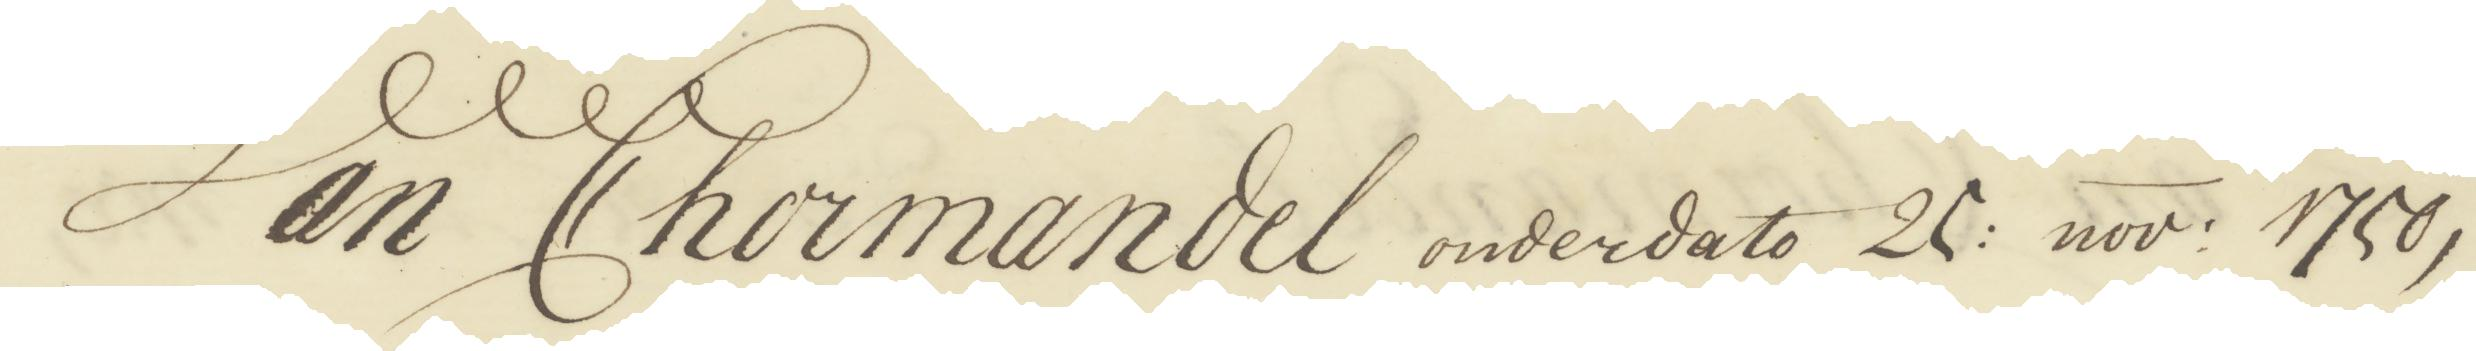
Van Chormandel onder dato 25:en nov: 1750,
